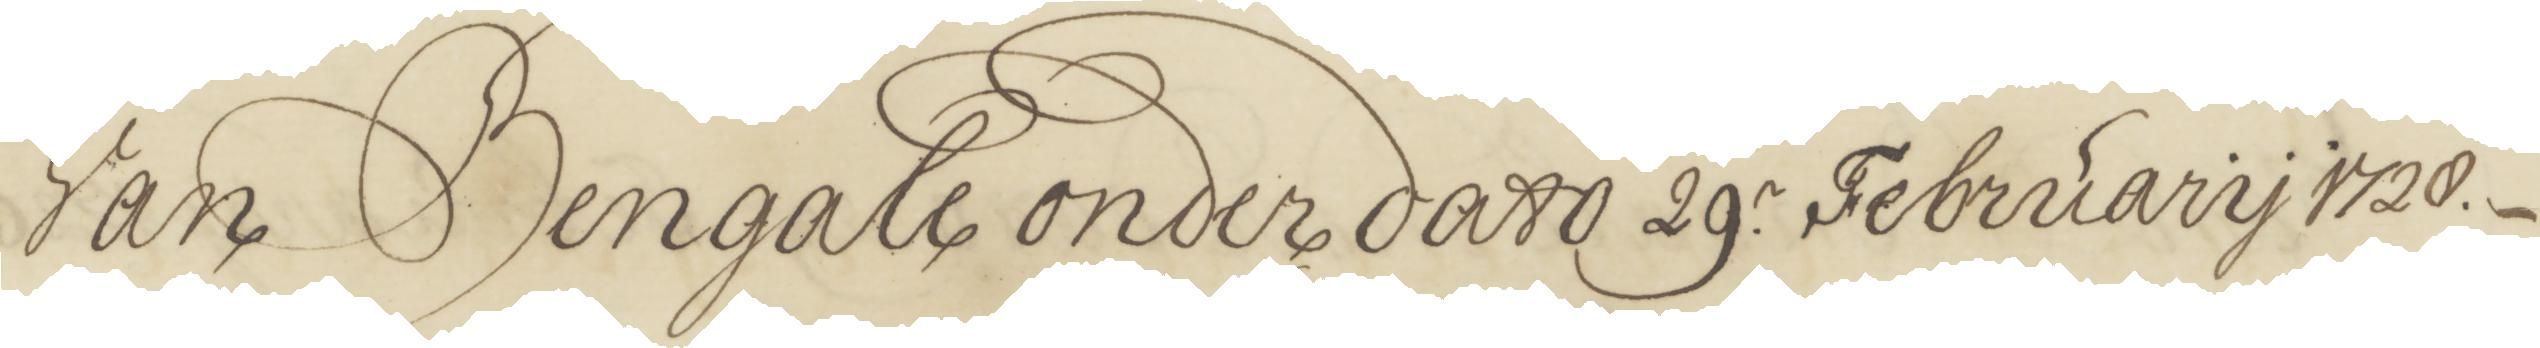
Van Bengale onder dato 29:' Februarij 1728. —
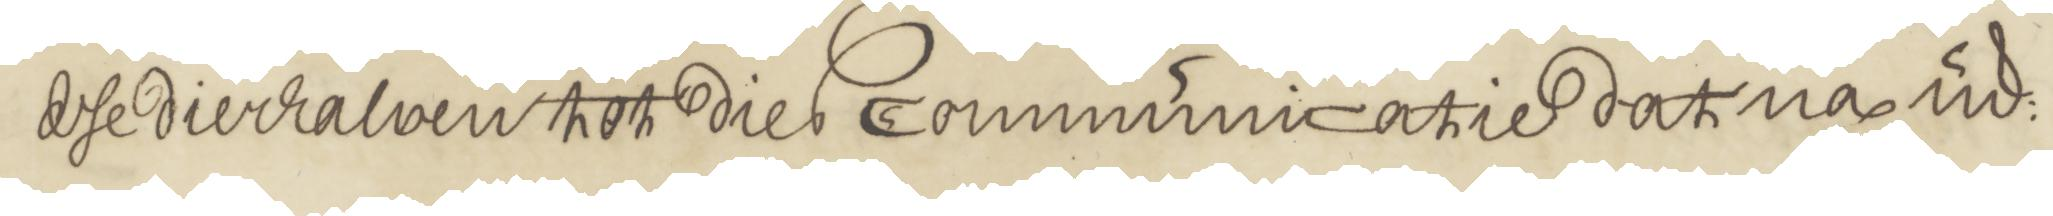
dese dierhalven tot dies communicatie dat na uE:
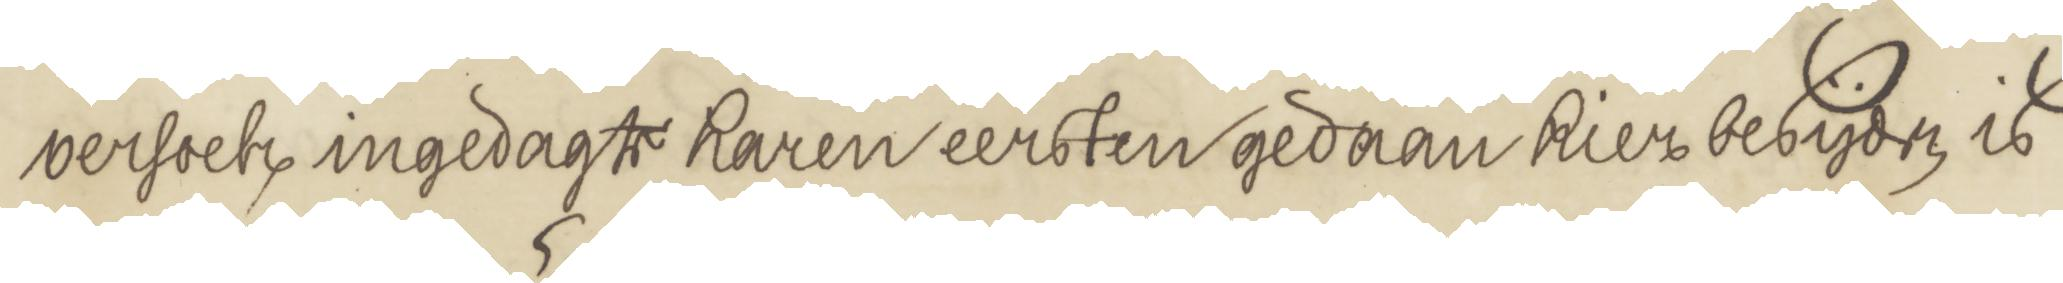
versoek ingedagte haren eersten gedaan hier besijden, is
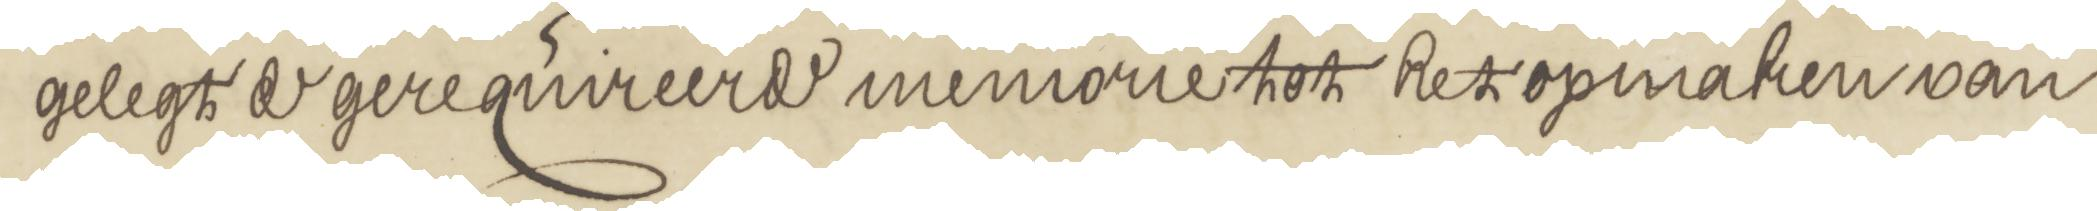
gelegt de gerequireerde memorie tot het opmaken van
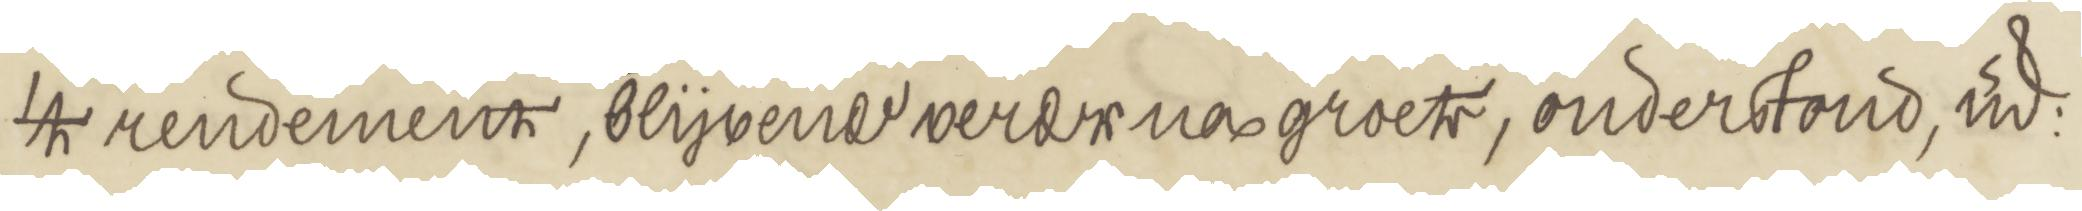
't rendement, blijvende verder na groete, onderstond, uE:
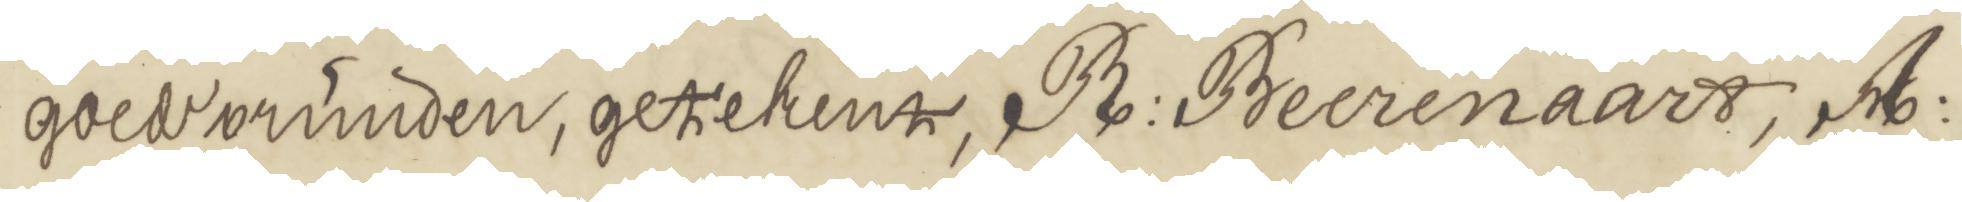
goede vrunden, getekent, R: Beerenaart; A:
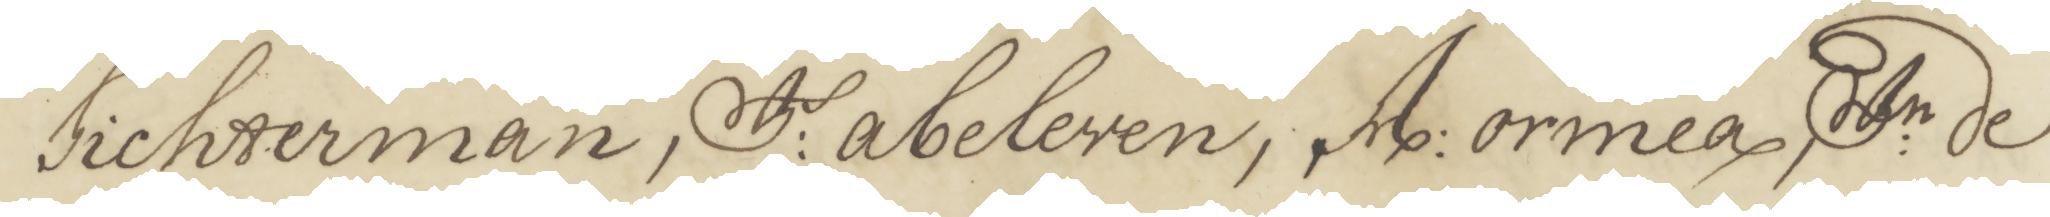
Sichterman, P:s abeleven, A:ormea, P„r de
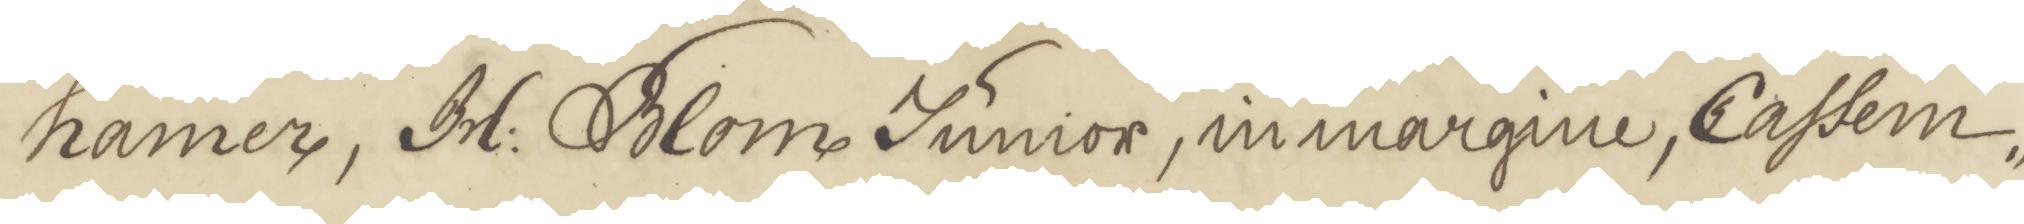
hamer, H: Blom Junior, in margine, Cassem,
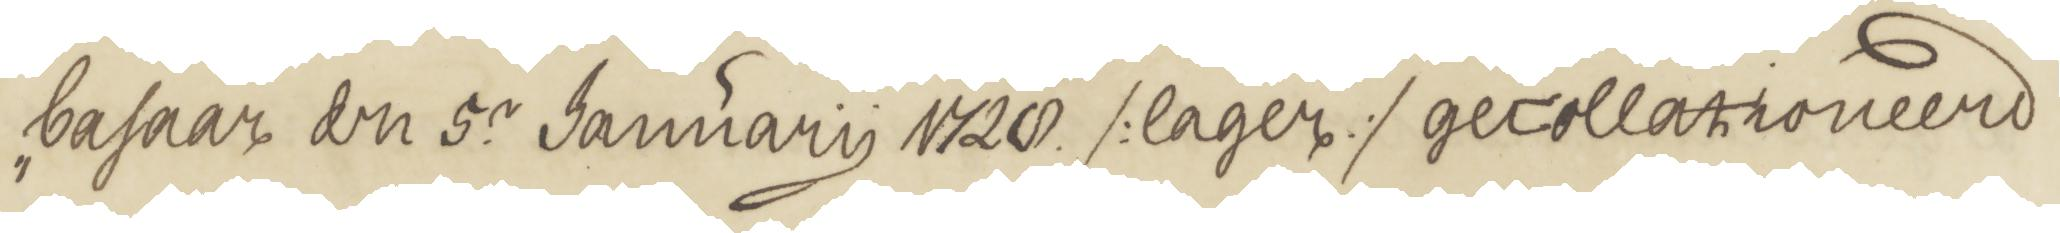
basaar den 5:e Januarij 1728. /:lager:/ gecollationeerd
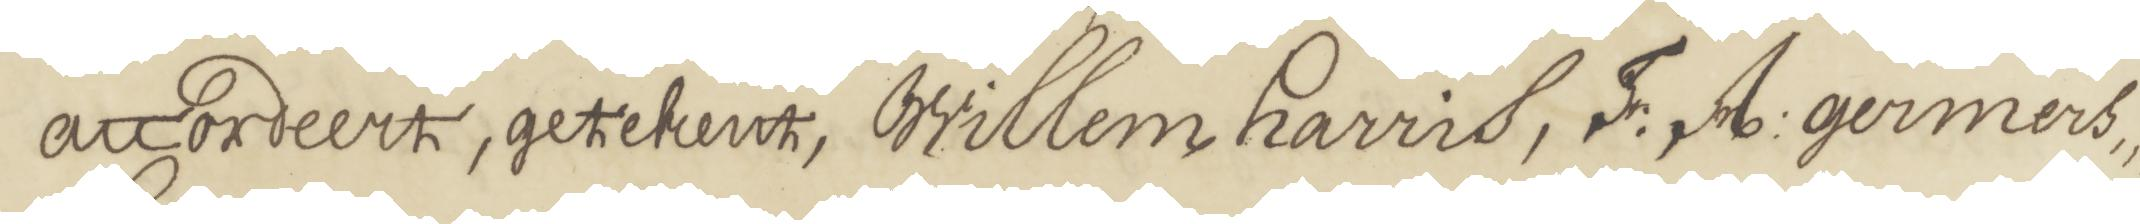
accordeert, getekent, Willem harris, J: A: germers„
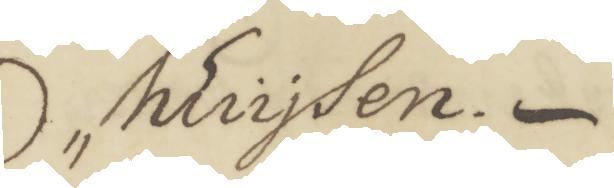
„huijsen. —
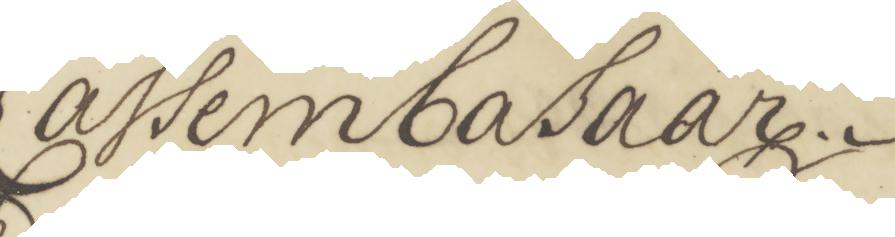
Cassembahaar. —
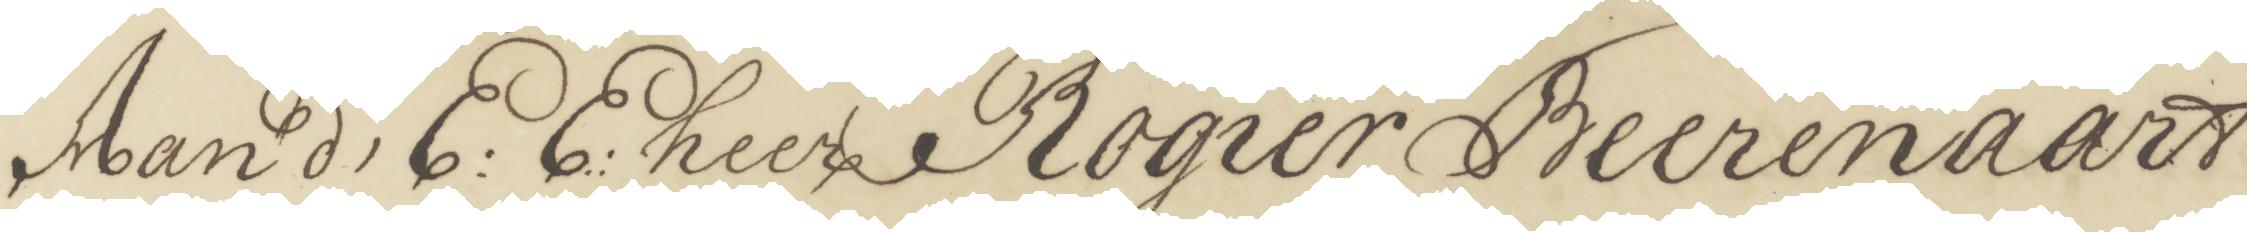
Aan d: E: E: heer Rogier Beerenaart
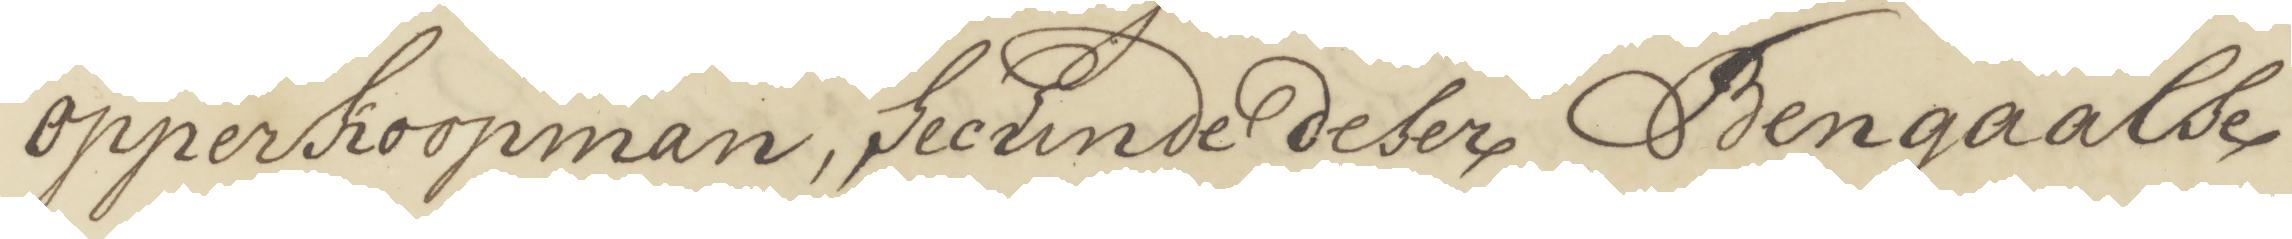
opperkoopman, secunde deser Bengaalse
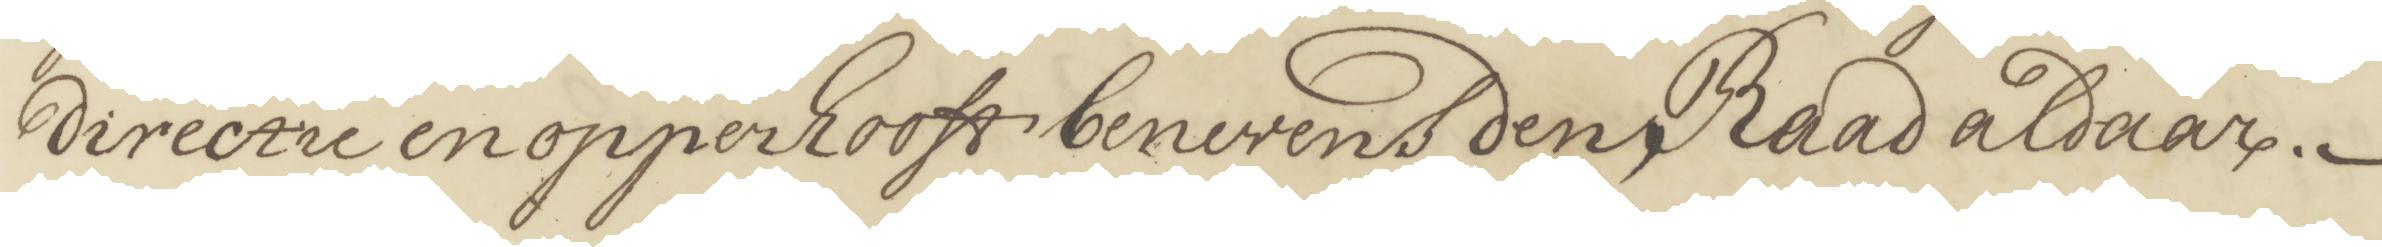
directie en opperhooft benevens den Raad aldaar. —
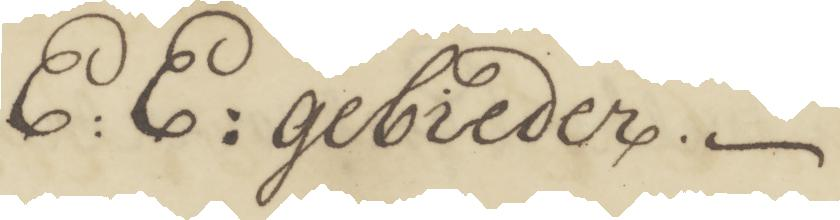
E: E: gebieder. —
